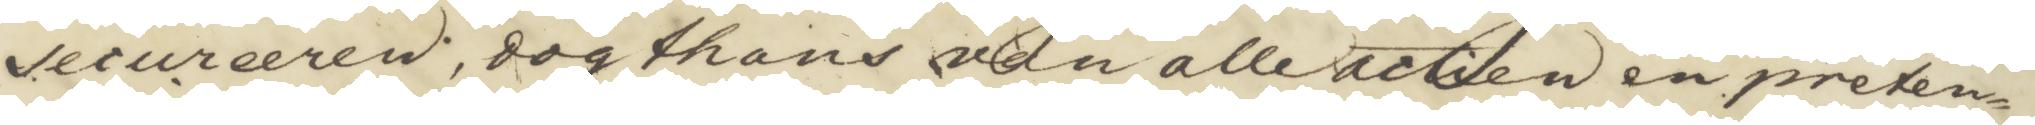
secureeren, dog thans van alle actien en preten=
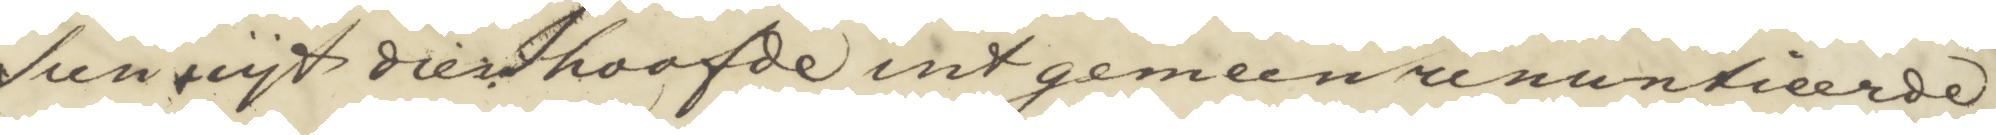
sien uijt dier hoofde int gemeen renuntieerde,
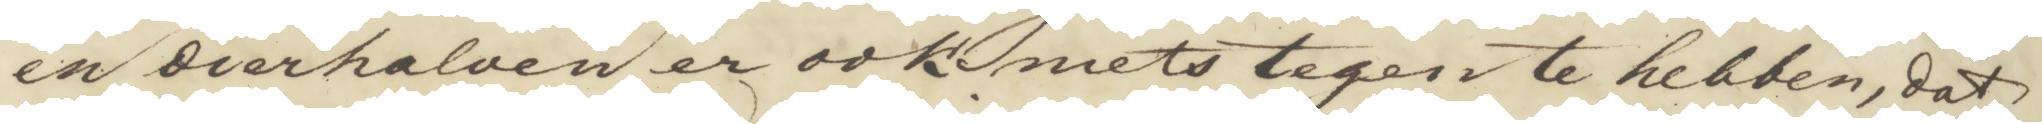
en dierhalven er ook niets tegen te hebben, dat
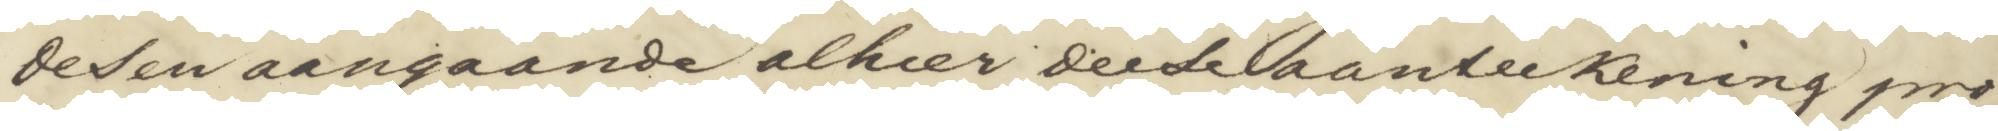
desen aangaande alhier deese aanteekening pro
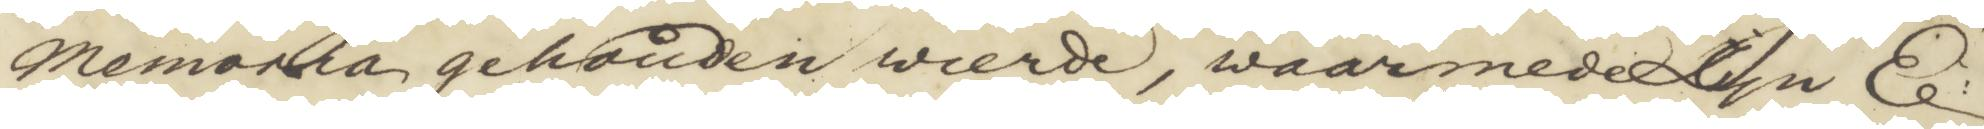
memoria gehouden wierde, waarmede zijn E:
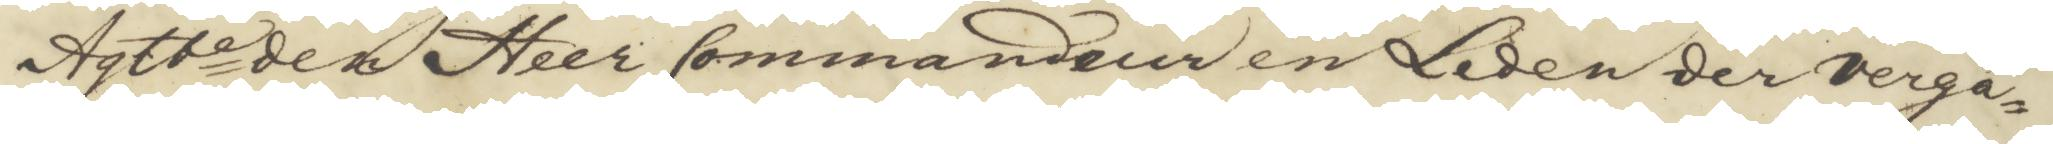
Agtb=e den Heer Commandeur en Leden der verga=
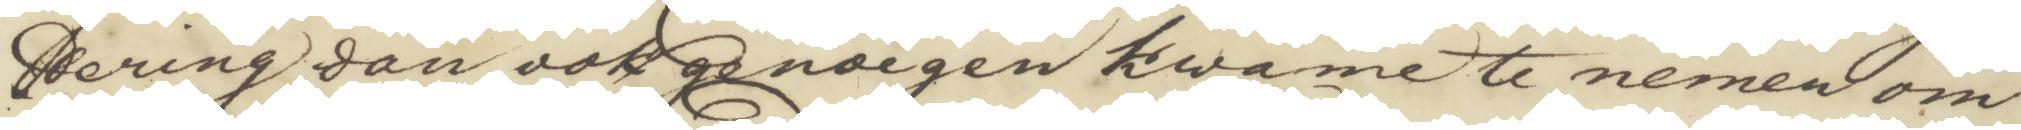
dering dan ook genoegen kwame te nemen om
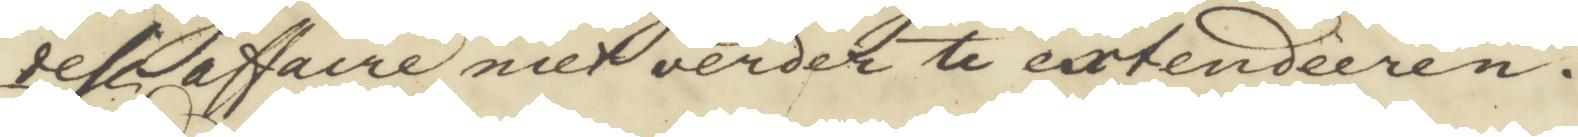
dese affaire niet verder te extendeeren.
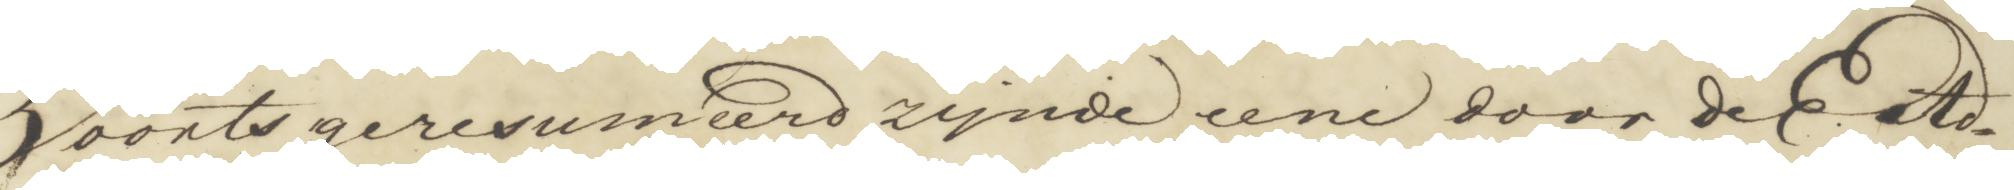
Voorts geresumeerd zijnde eene door de E. Ad=
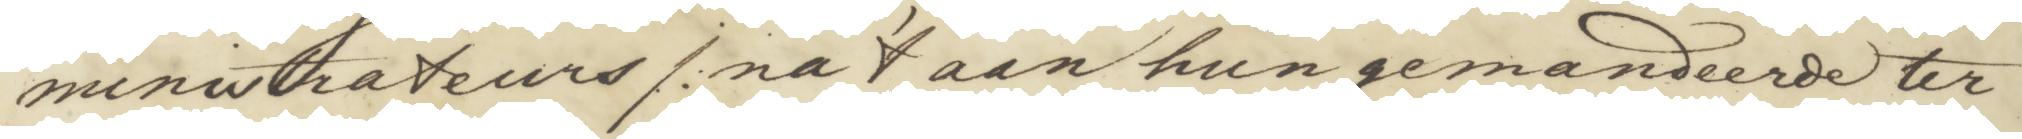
minstrateurs /: na ’t aan hun gemandeerde ter
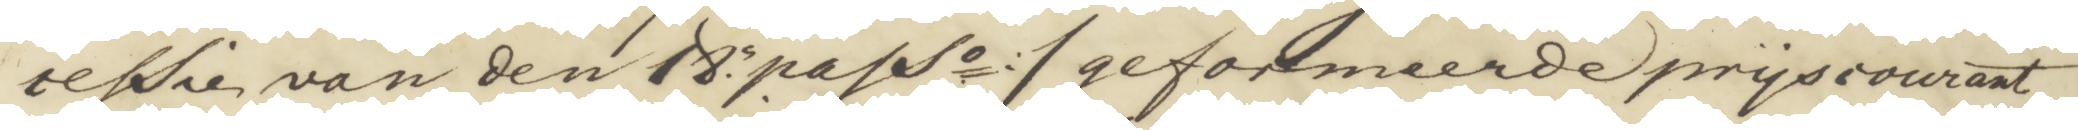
cessie van den 18." pass=o :/ geformeerde prijs courant
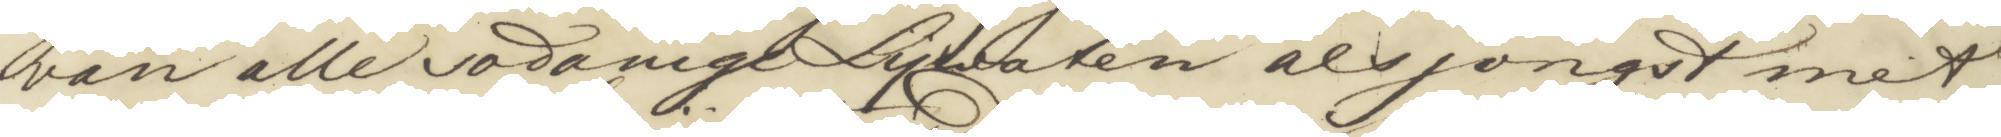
van alle sodanige Lijwaten als jongst met
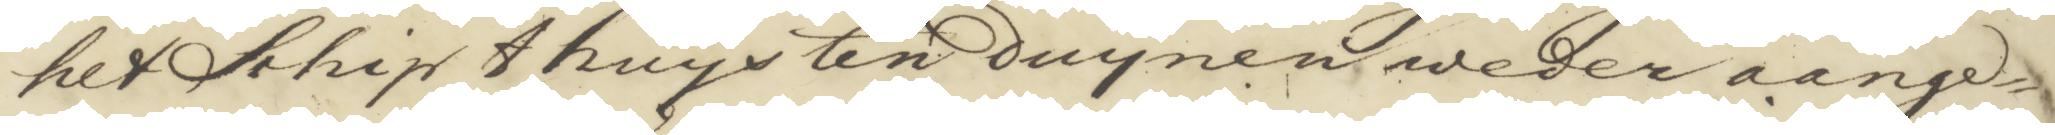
het schip 't huijs ten duijnen weder aange=
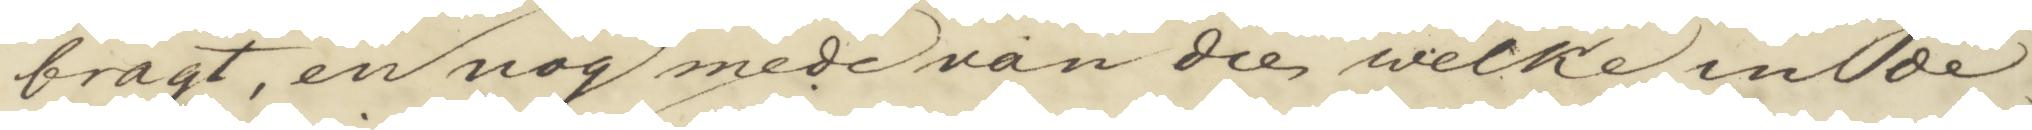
bragt, en nog mede van die welke in de
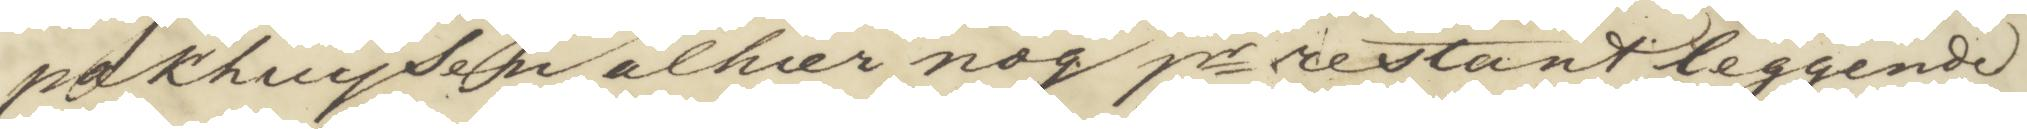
pakhuijsen alhier nog p=r restant leggende
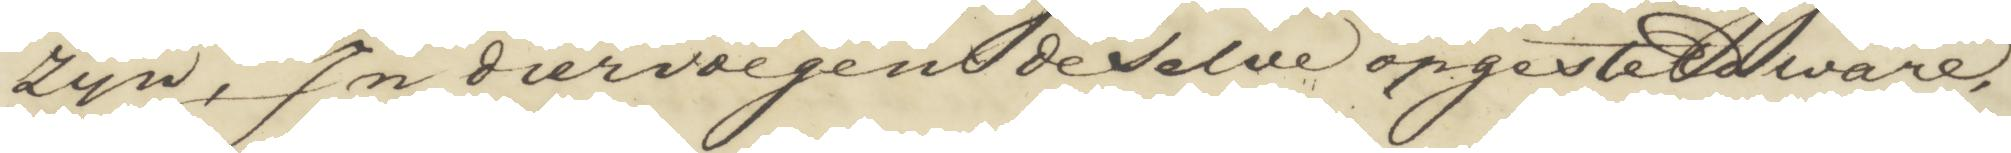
zijn; Jn diervoegens deselve opgestald ware,
